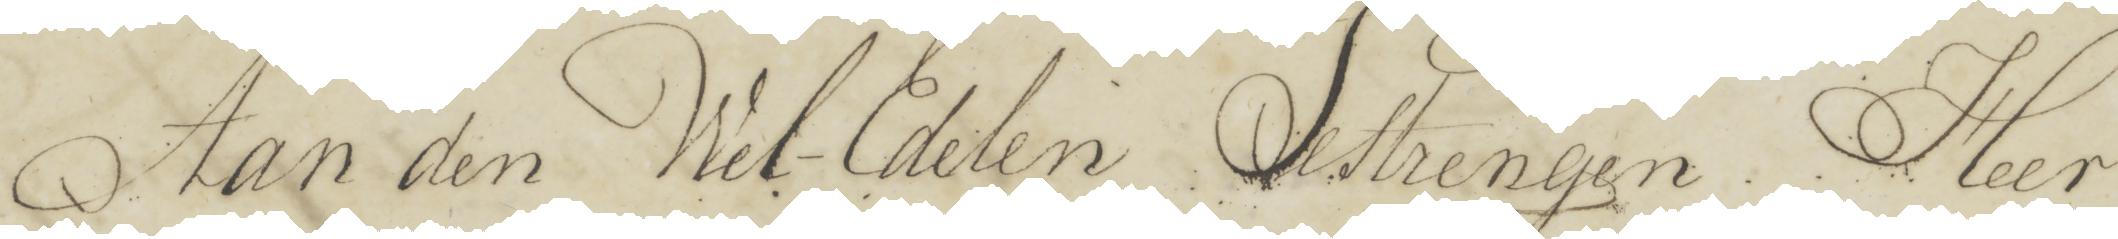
Aan den Wel-Edelen Gestrengen Heer
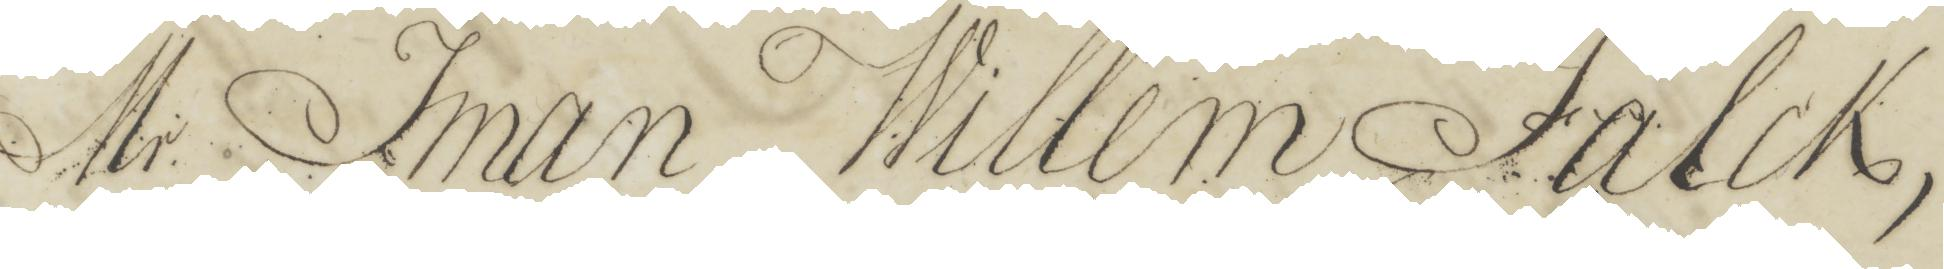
Mr. Iman Willem Falck,
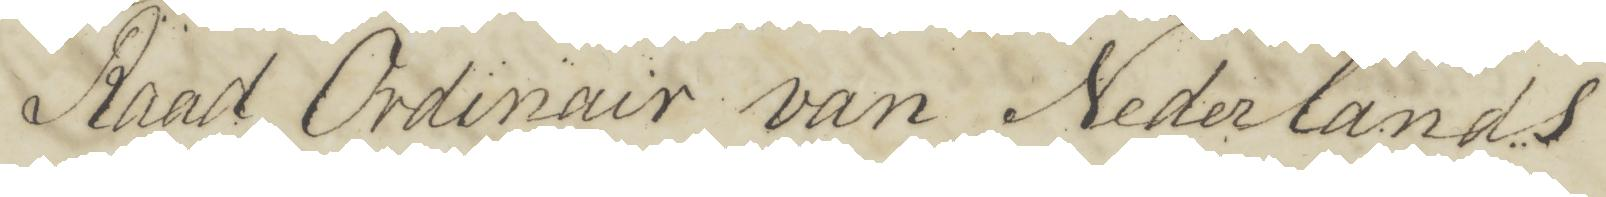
Raad Ordinair van Nederlands
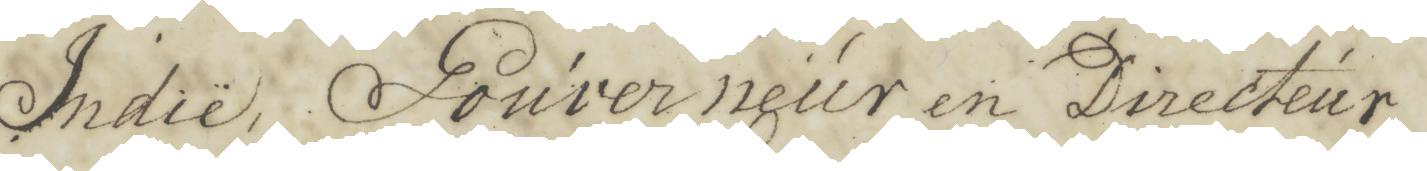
Indie, Gouverneur en Directeur
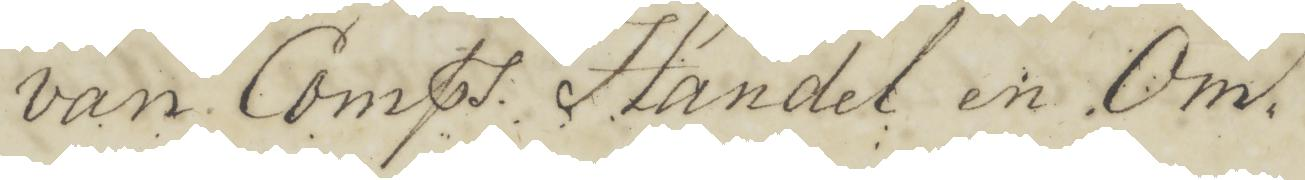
van Comps. Handel en Om„
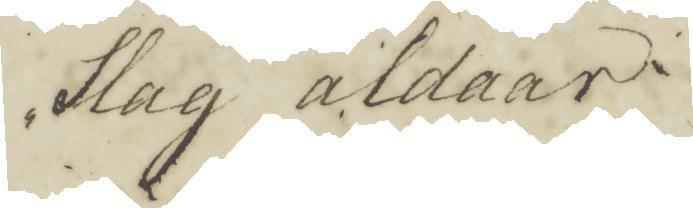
„slag aldaar.
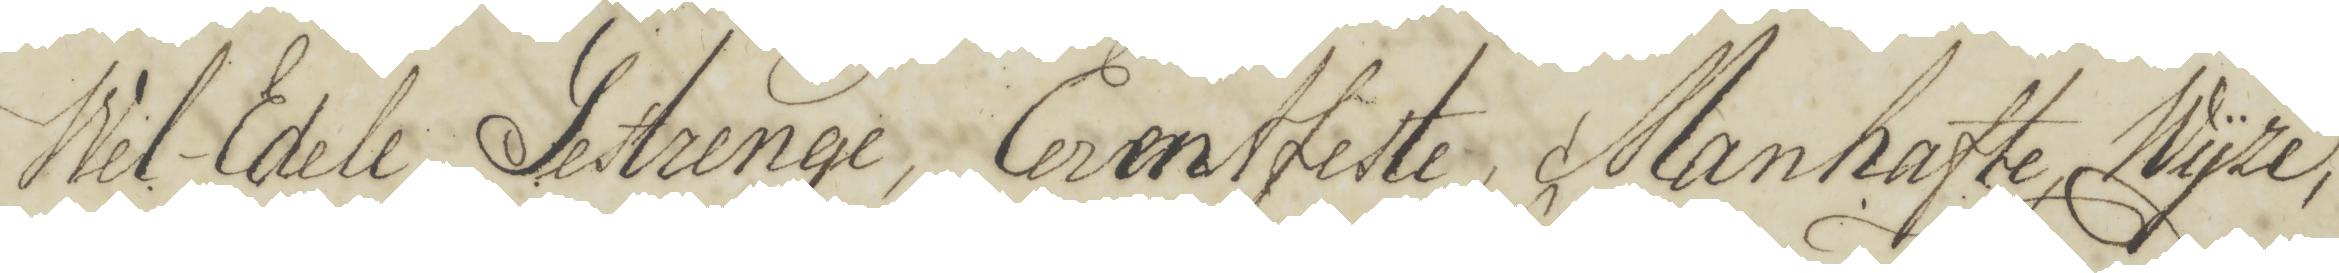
Wel Edele, Gestrenge, Eerentfeste, Manhafte, Wijze,
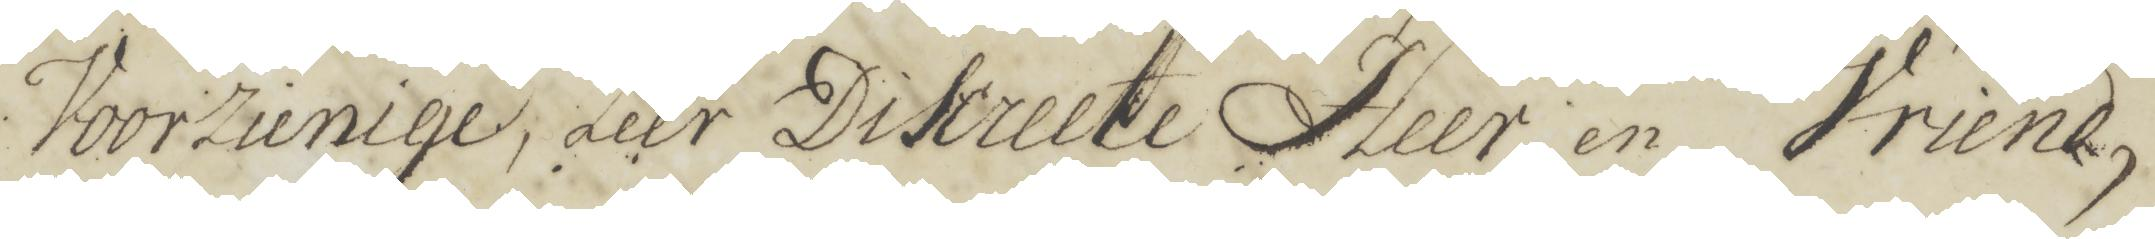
Voorzienige, zeer Discreete Heer en Vriend,
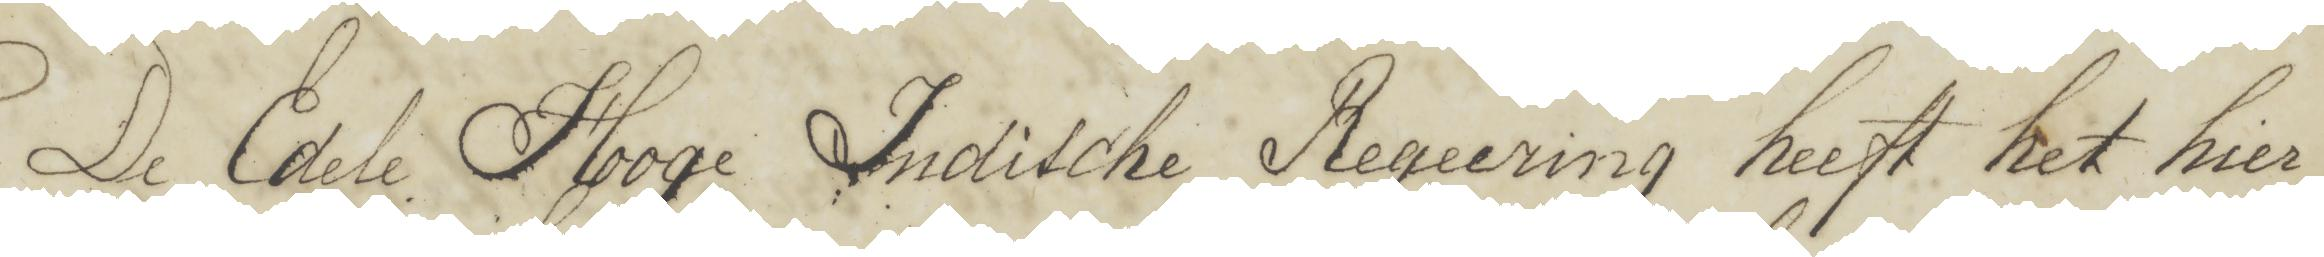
De Edele Hooge Indische Regeering heeft het hier
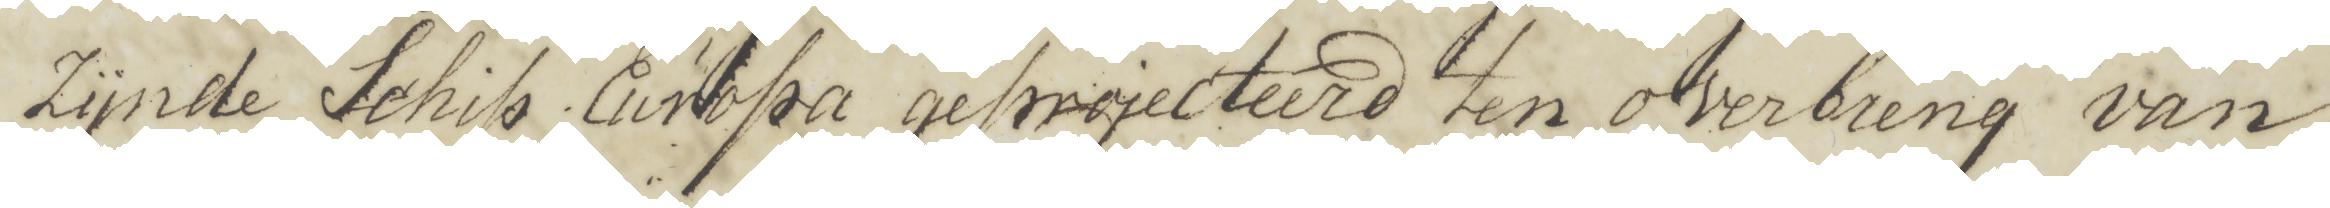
zijnde schip Europa geprojecteerd ten overbreng van
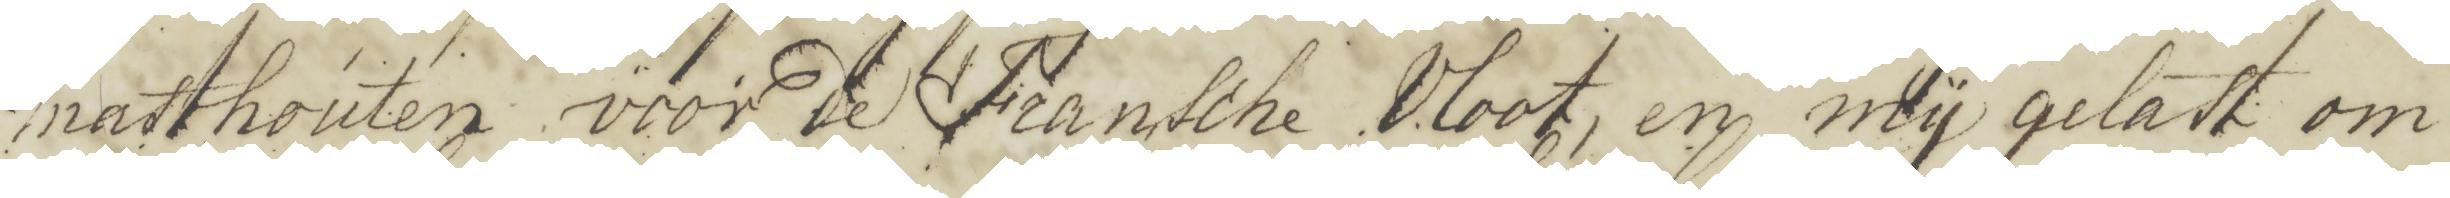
masthouten voor de Fransche Vloot, en mij gelast om
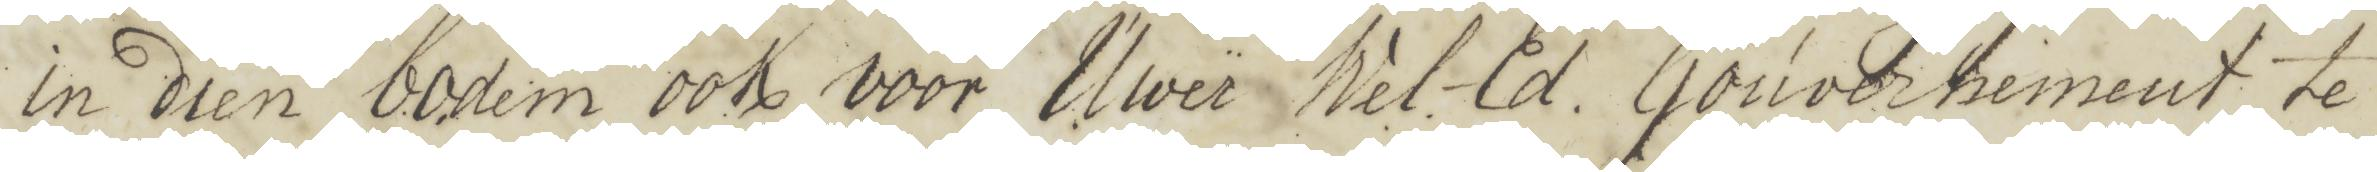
in dien bodem ook, voor Uwer Wel: Ed. Gouvernement te
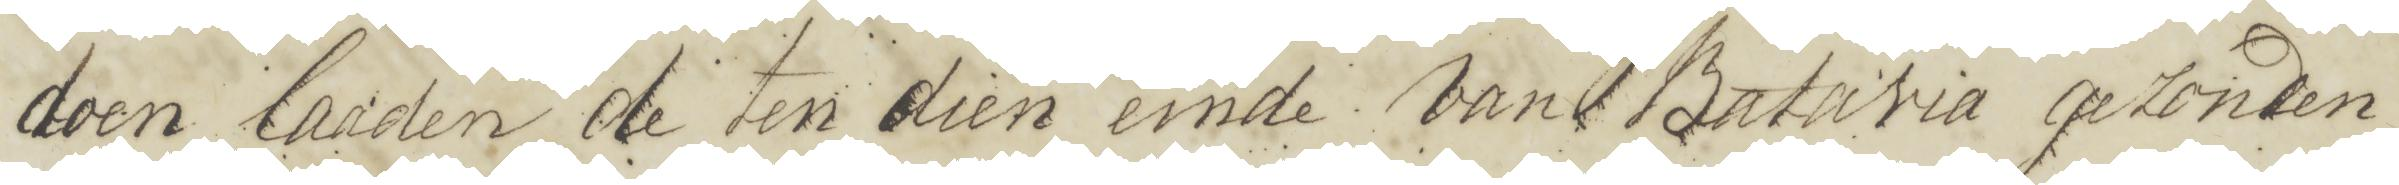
doen laaden de ten dien einde van Batavia gezonden
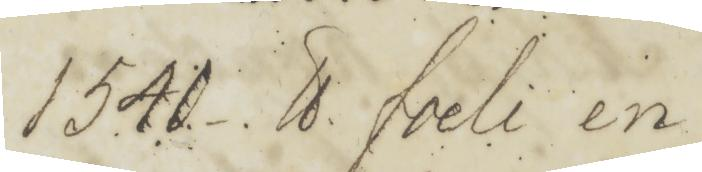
1540.-. lb. foeli en
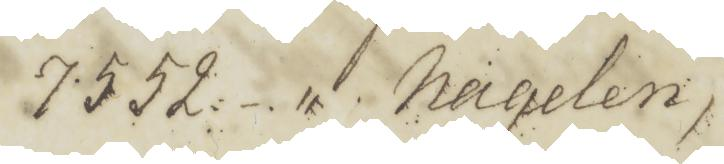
7552:-. „ nagelen,
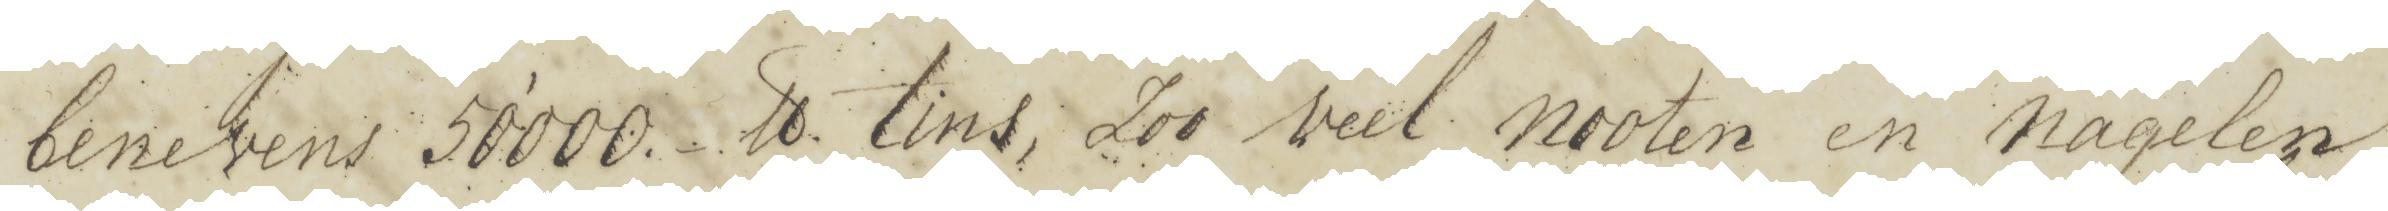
benevens 50'000: -. lb. tins, zoo veel nooten en nagelen
